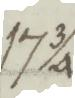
17¾
